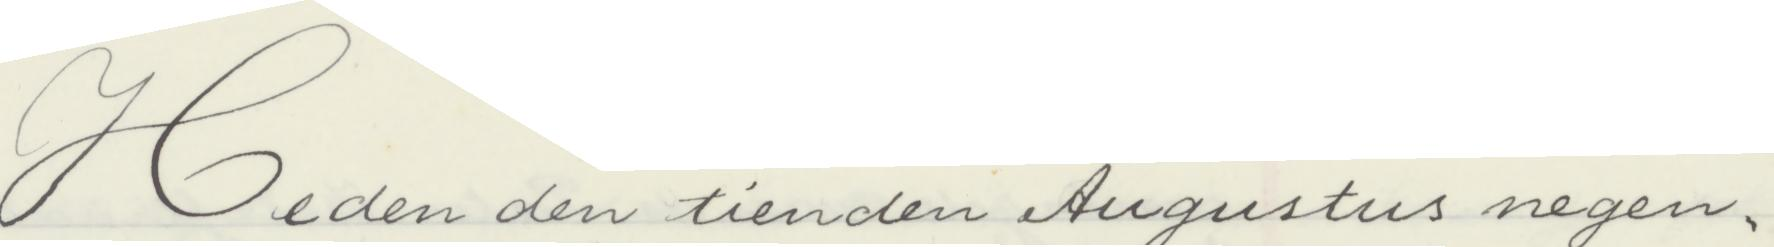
Heden den tienden Augustus negen„
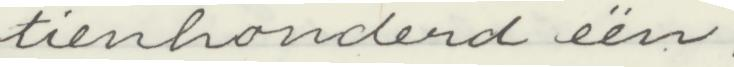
tienhonderd één
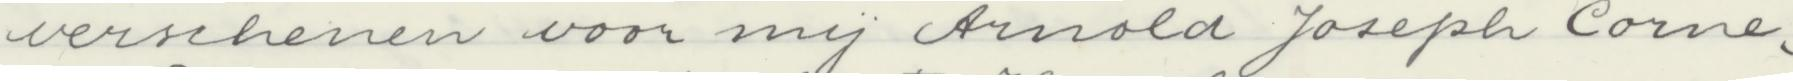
verschenen voor mij Arnold Joseph Corne
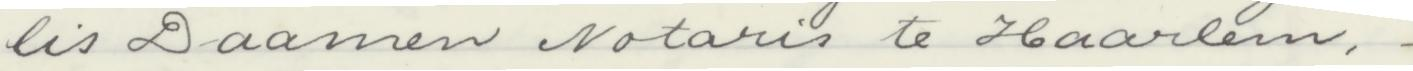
lis Daamen Notaris te Haarlem,
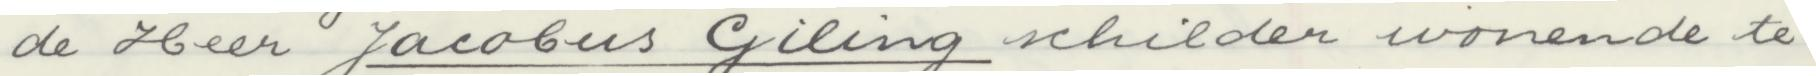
de Heer Jacobus Giling schilder wonende te
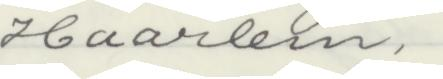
Haarlem,
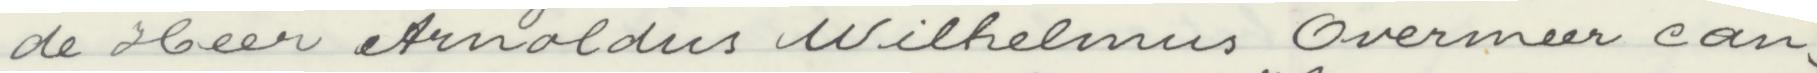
de Heer Arnoldus Wilhelmus Overmeer can
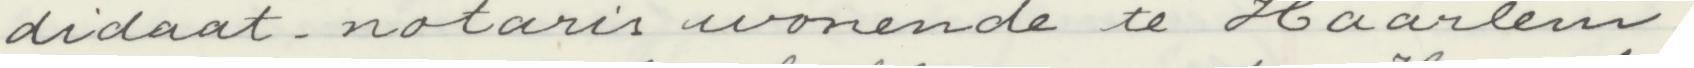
didaat notaris wonende te Haarlem,
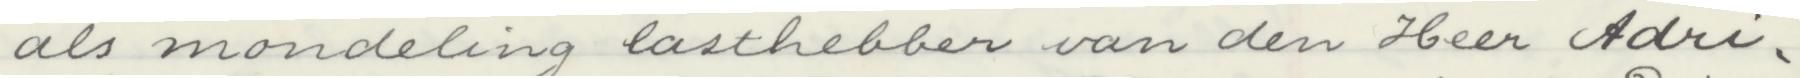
als mondeling lasthebber van den Heer Adri
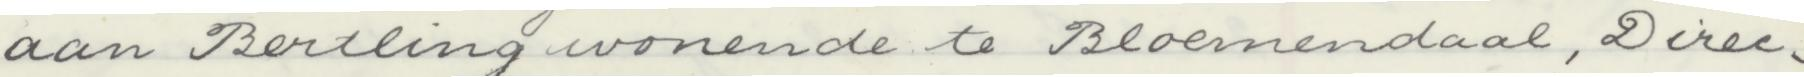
aan Bertling wonende te Bloemendaal, Direc
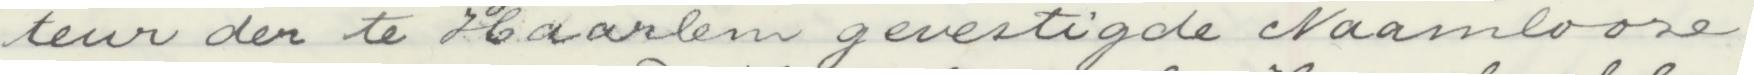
teur der te Haarlem gevestigde Naamlooze
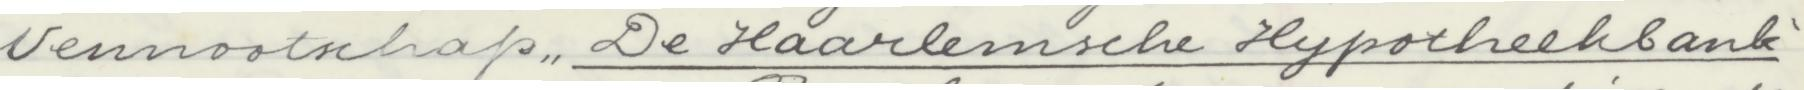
Vennootschap „ De Haarlemsche Hypotheekbank
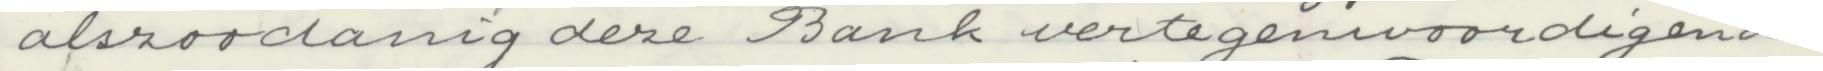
alszoodanig deze Bank vertegenwoordigende
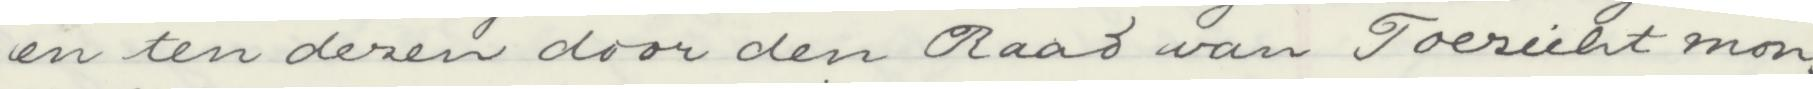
en ten dezen door den Raad van Toezicht mon
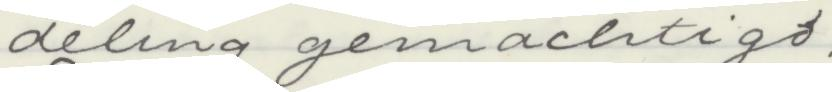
deling gemachtigd
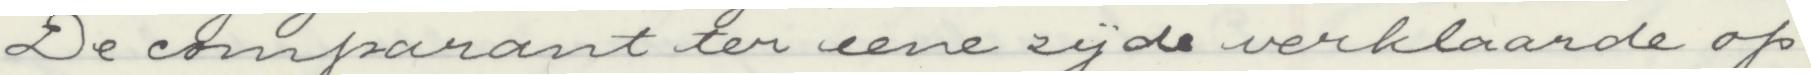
De comparant ter eene zijde verklaarde op
